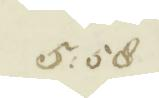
5: 58
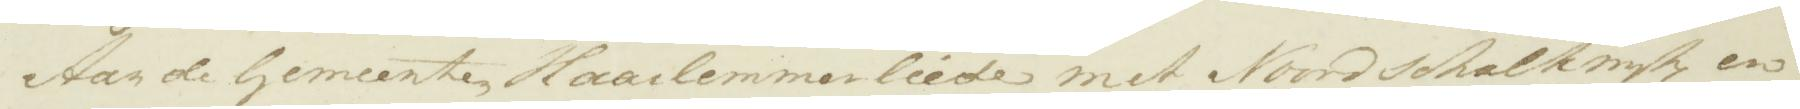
Aan de Gemeenten Haarlemmerliede met Noord schalkwyk en
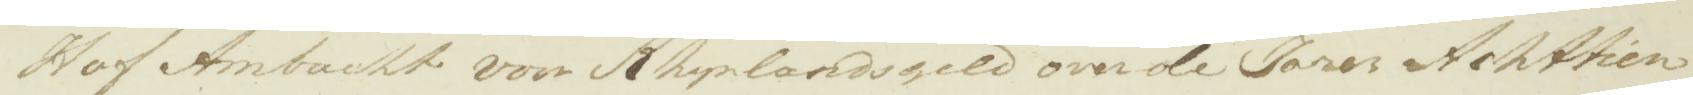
Hof Ambacht voor Rhynlandsgeld over de Iaren Achttien
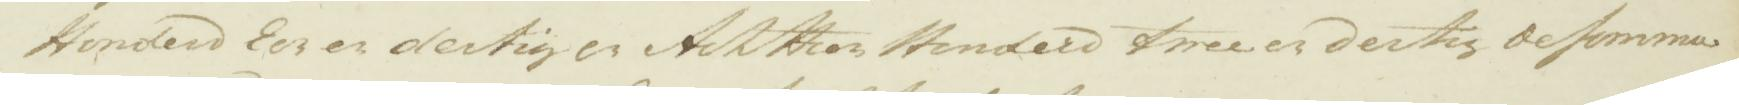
Honderd Een en dertig en Achttien Honderd twee en dertig de somma
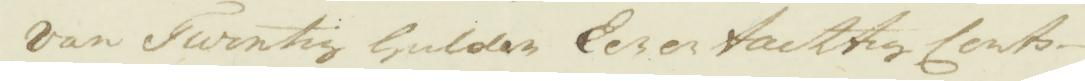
van Twintig Gulden Een en tachtig Cents
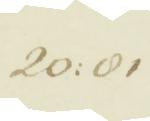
20: 81
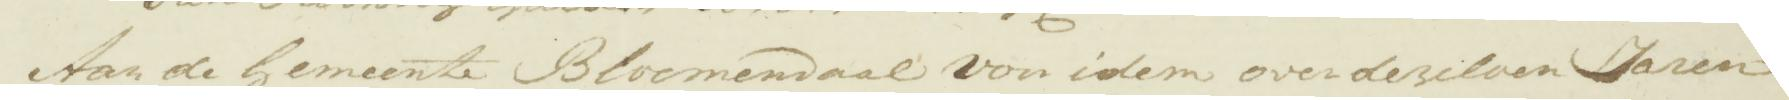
Aan de Gemeente Bloemendaal voor idem over dezelven Iaren
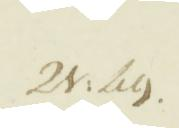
21:49.
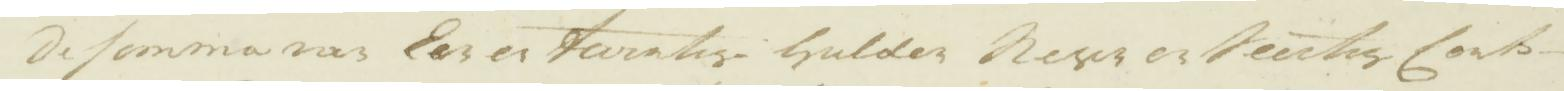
de somma van Een en twintig Gulden Negen en Veertig Cents-
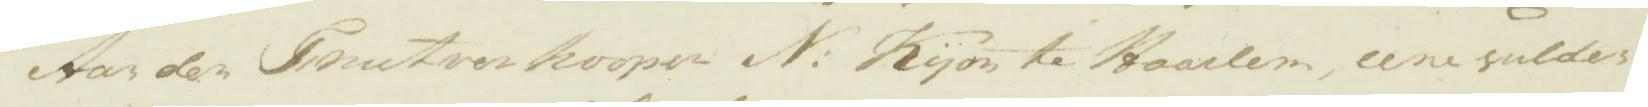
Aan den Grutverkooper N: Kijn te Haarlem, eene gulden
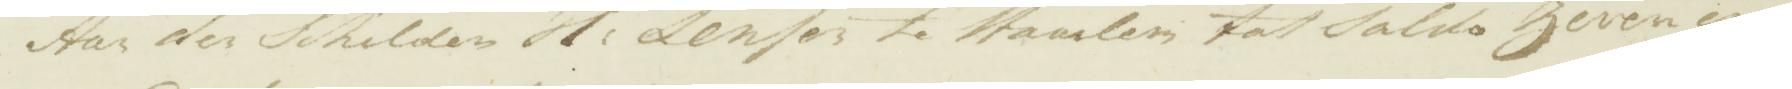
Aan der schilder H: Lensen te Haarlem tot saldo Zeven en
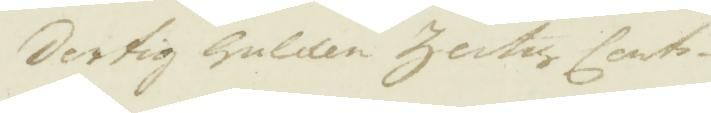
Dertig Gulden Zestig Cents-
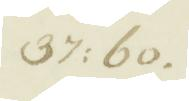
37: 60.
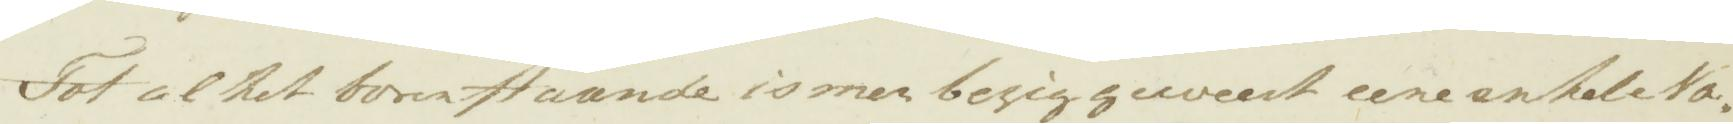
Tot al het bovenstaande is men bezig geweest eene en hele Va„
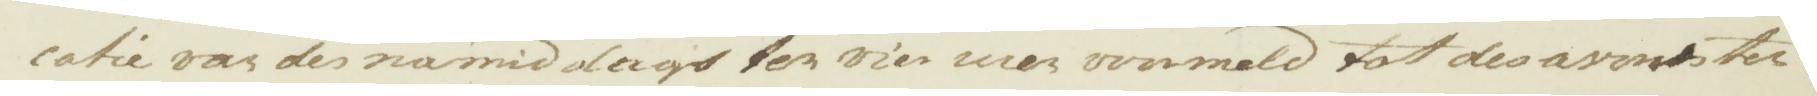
catie van des namiddags ten vier uren voormeld tot des avonts ten
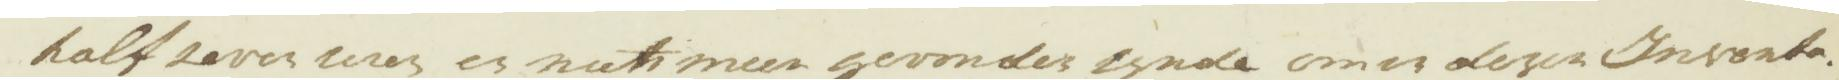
half zeven uren en niets meer gevonder zynde om is dezes Inventa„
